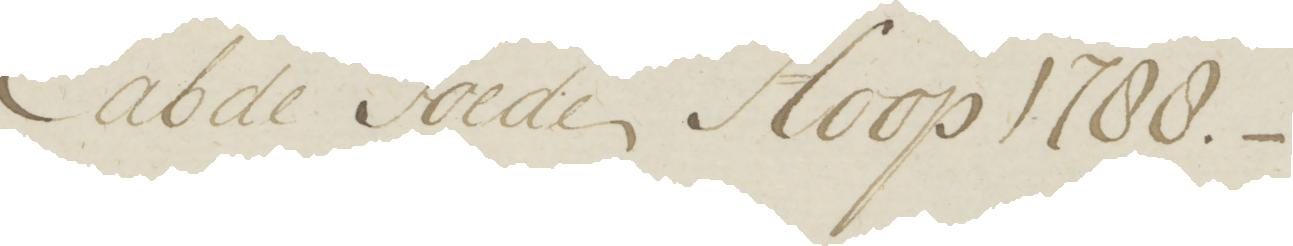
Cabde joede Hoop 1788._
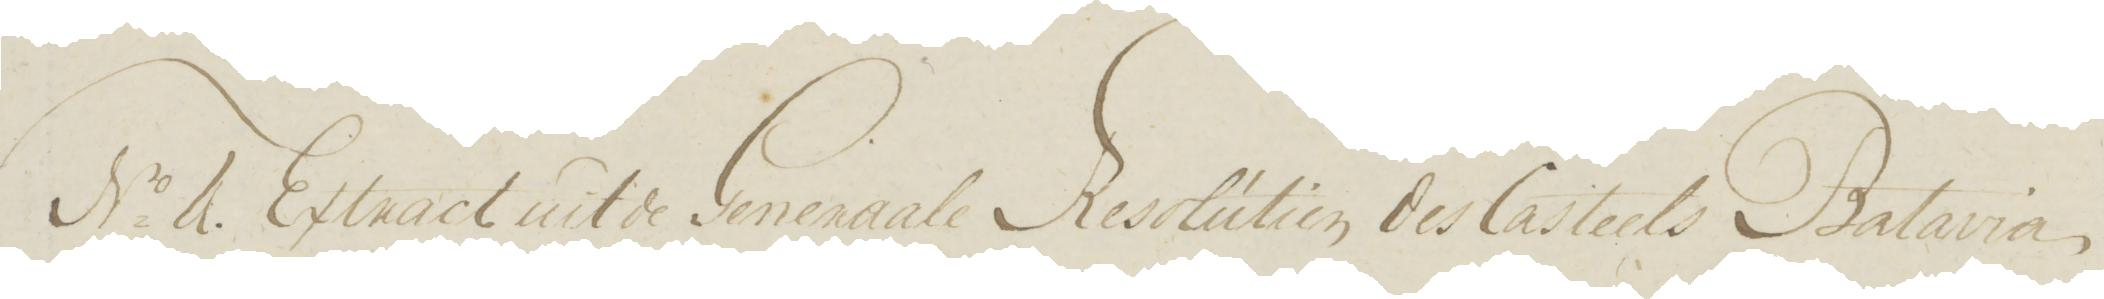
N=o 4. Extract uit de Generaale Resolutien des Casteels Batavia
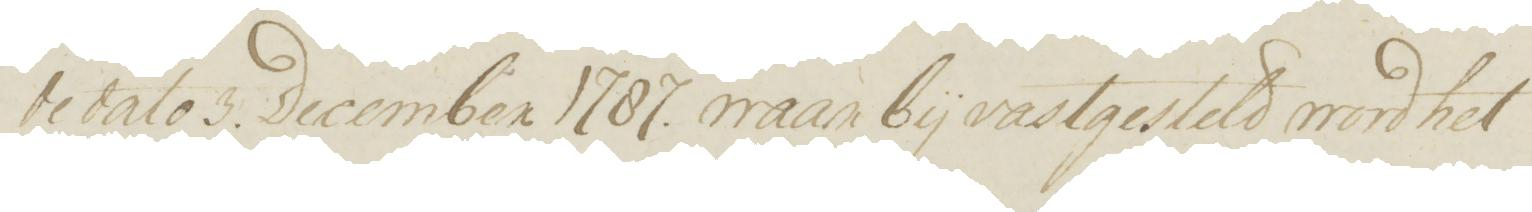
de dato 3. December 1787. waar bij vastgesteld word het
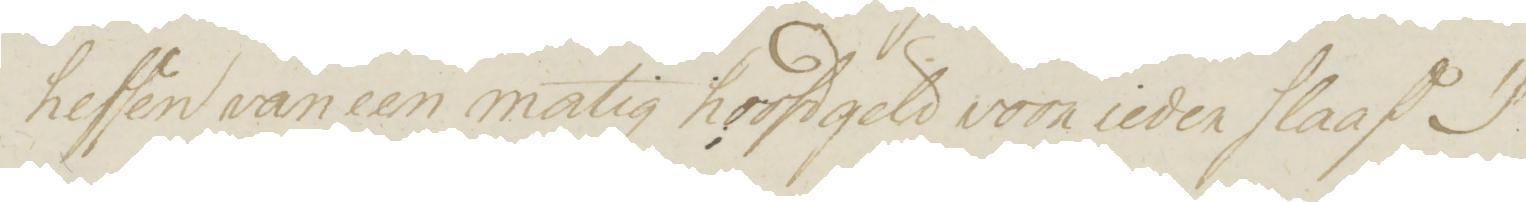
heffen van een matig hoofdgeld voor ieder slaaf 'S
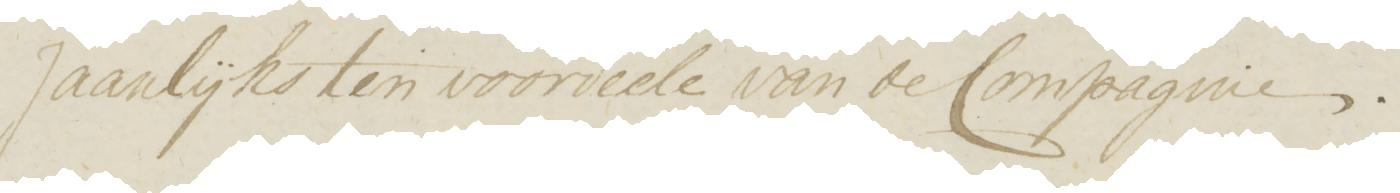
Jaarlijks ten voordeele van de Compagnie.
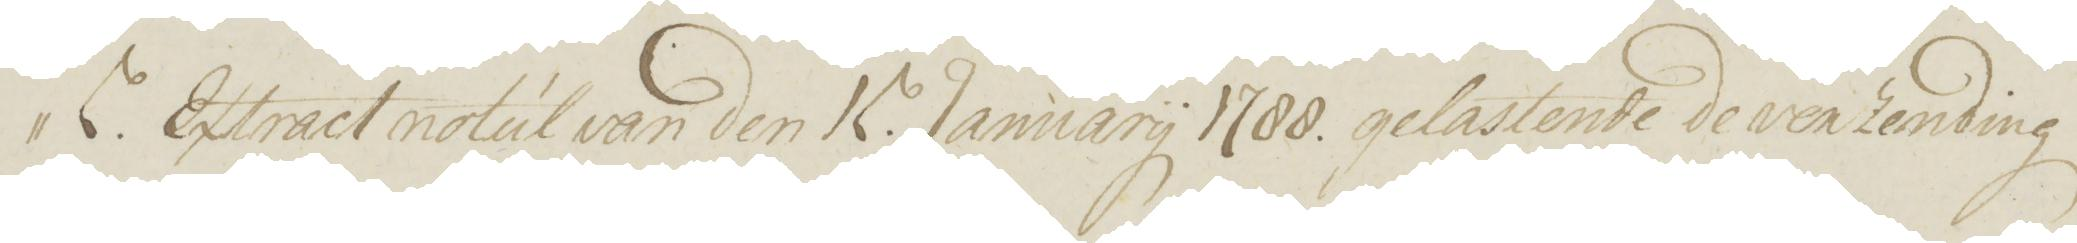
„ 5. Extract notul van den 15. Januarij 1788. gelastende de verzending
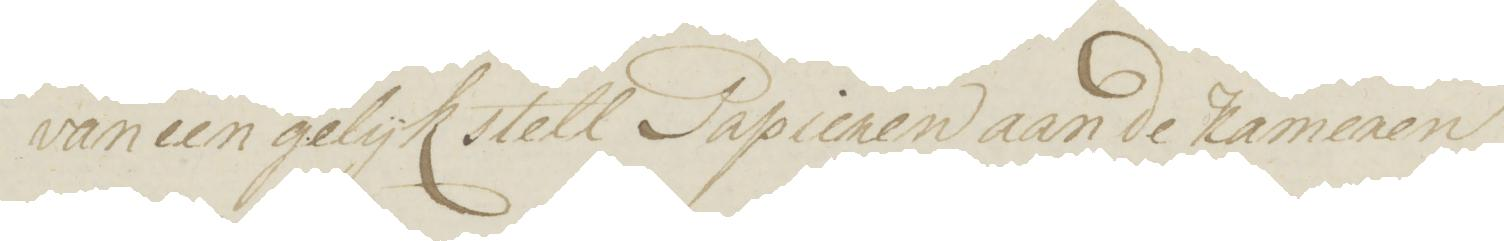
van een gelijk stell Papieren aan de Kameren
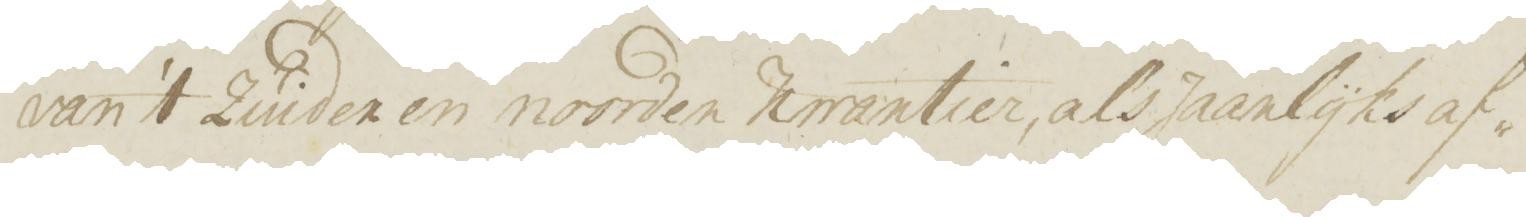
van ’t Zuider en noorder kwartier, als Jaarlijks af„
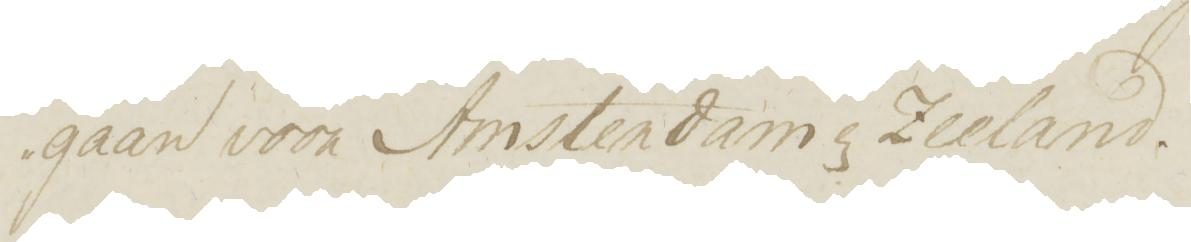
„gaan voor Amsterdam en Zeeland.
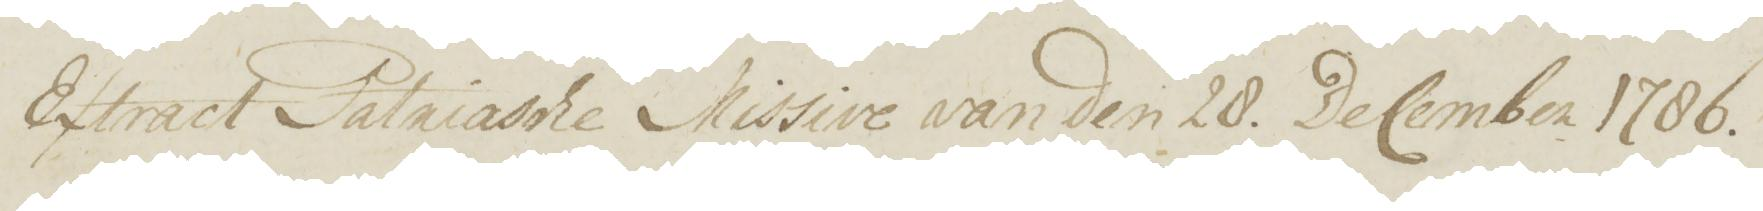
Extract Patriasche Missive van den 28. December 1786.
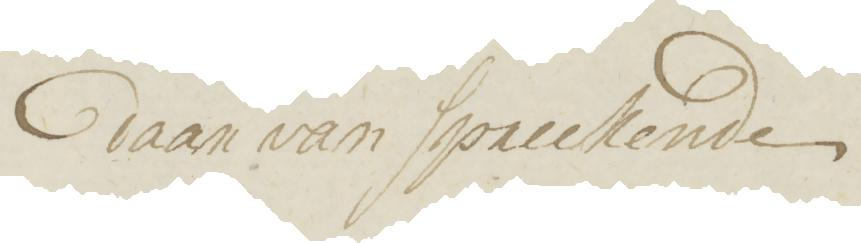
daar van spreekende
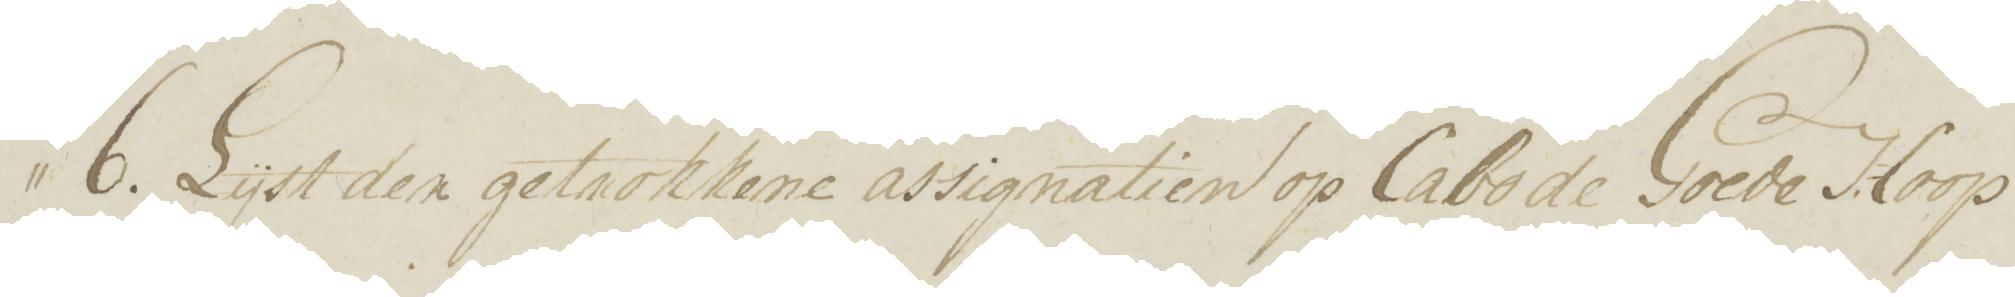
„ 6. Lijst der getrokkene assignatien op Cabo de Goede Hoop
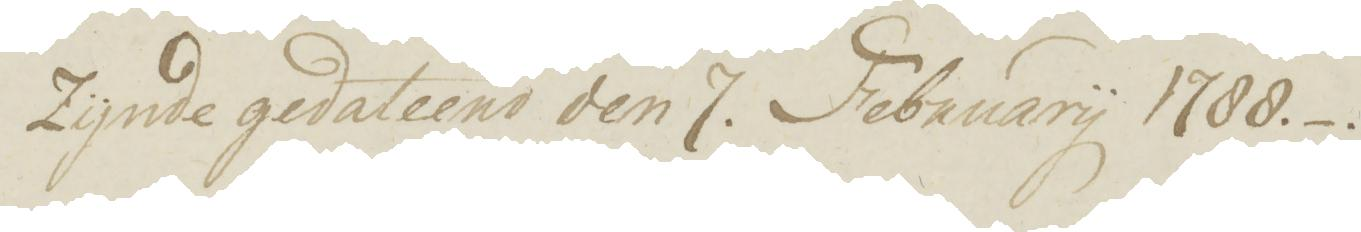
zijnde gedateerd den 7. Februarij 1788._.
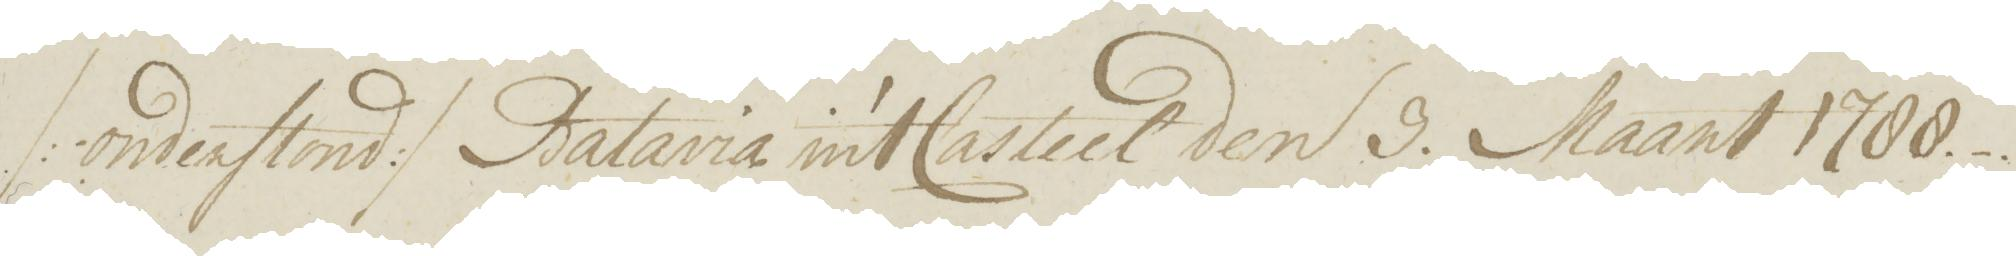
/:onderstond:/ Batavia in't Casteel den 3. Maart 1788._.
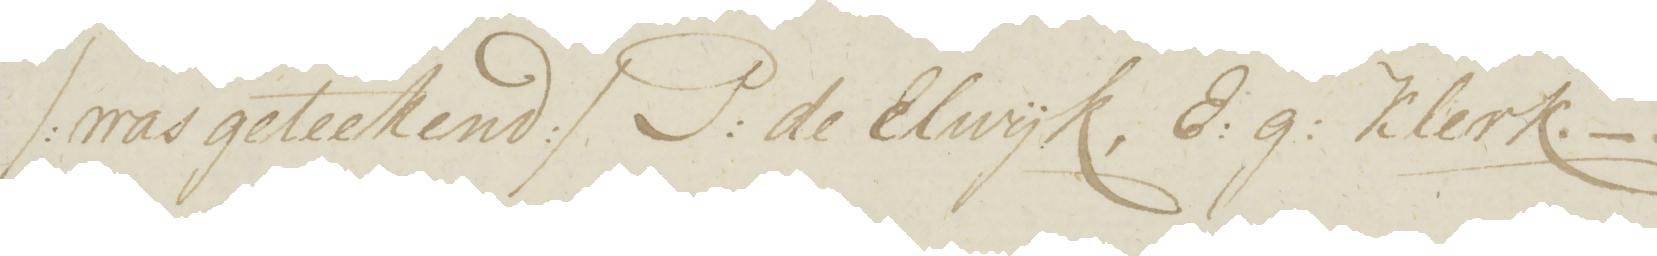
/:was geteekend:/ P: de Elwijk, E:g: Klerk._
